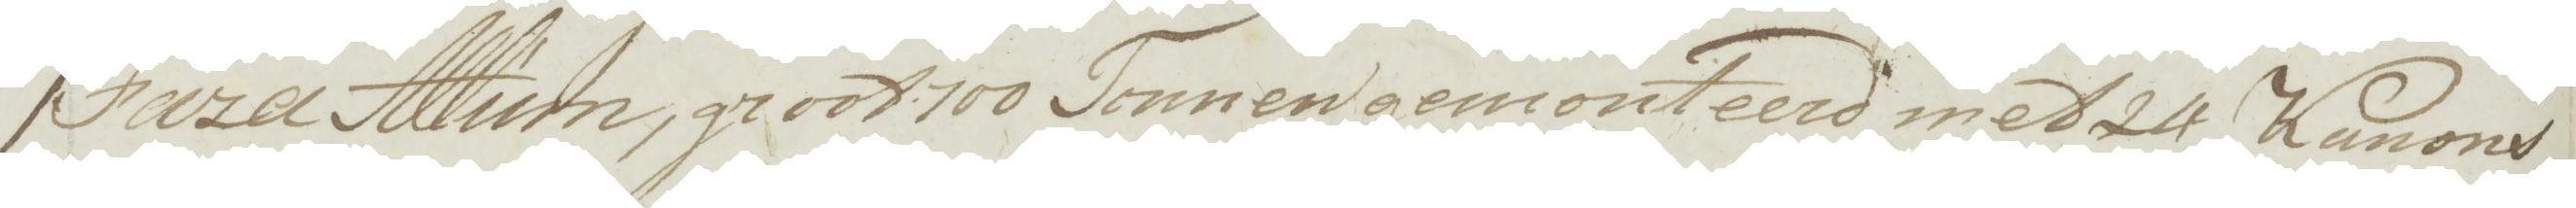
Faza Allum, groot 100 Tonnen gemonteerd met 24 Kanons
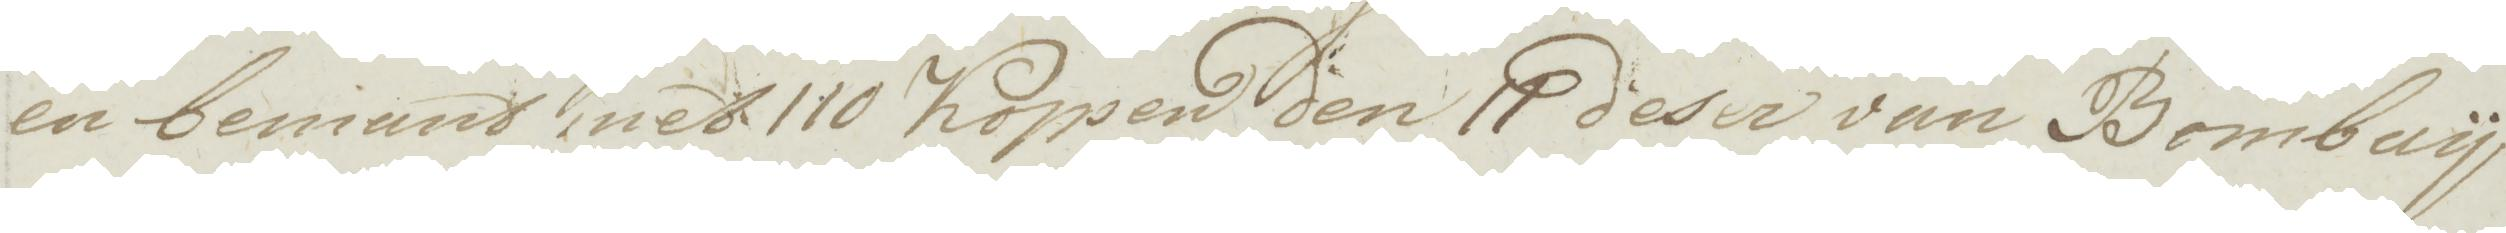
en bemant met 110 Koppen den 11 deser van Bombaij
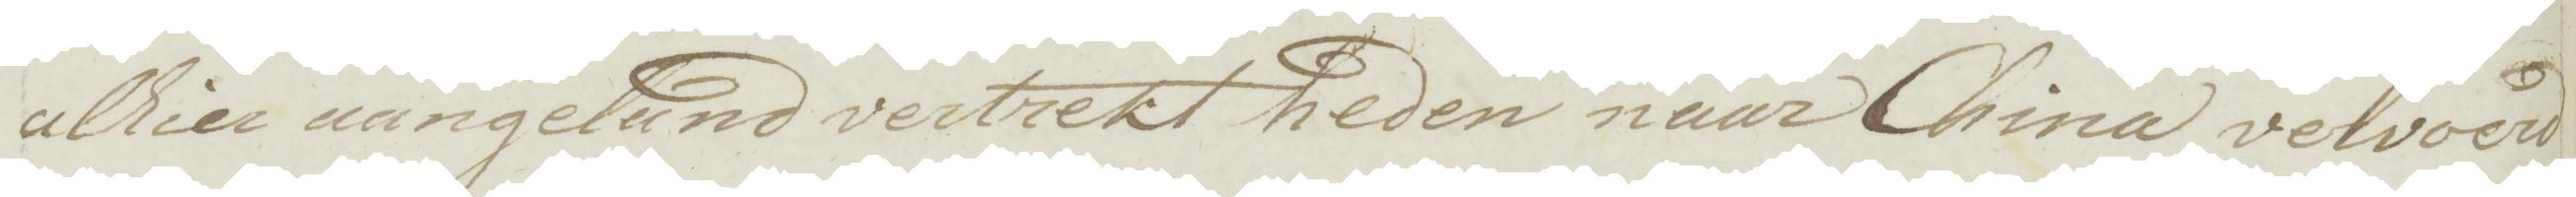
alhier aangeland vertrekt heden naar China vervoerd
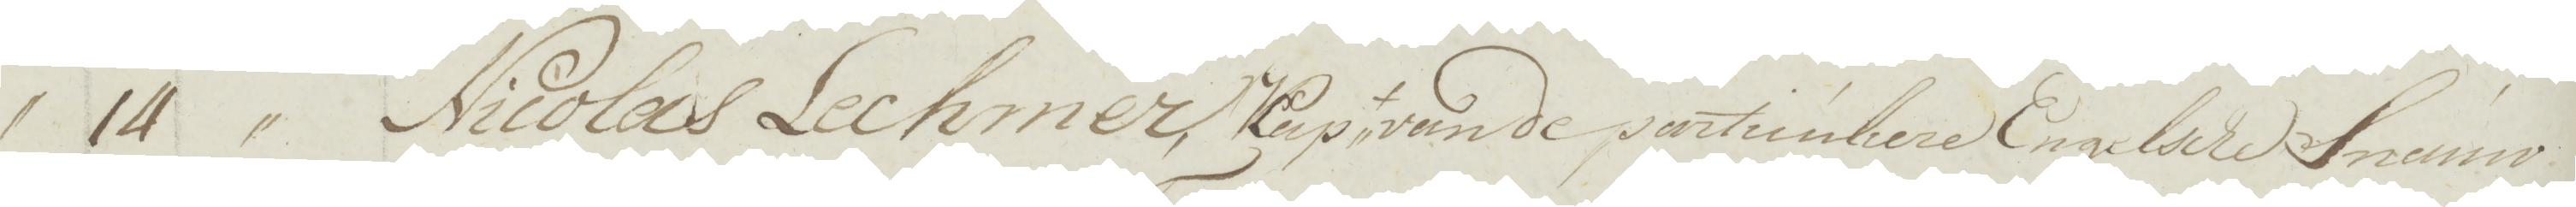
„ 14 „ Nicolas Lechmer, Kap„t van de particuliere Engelsche Snauw
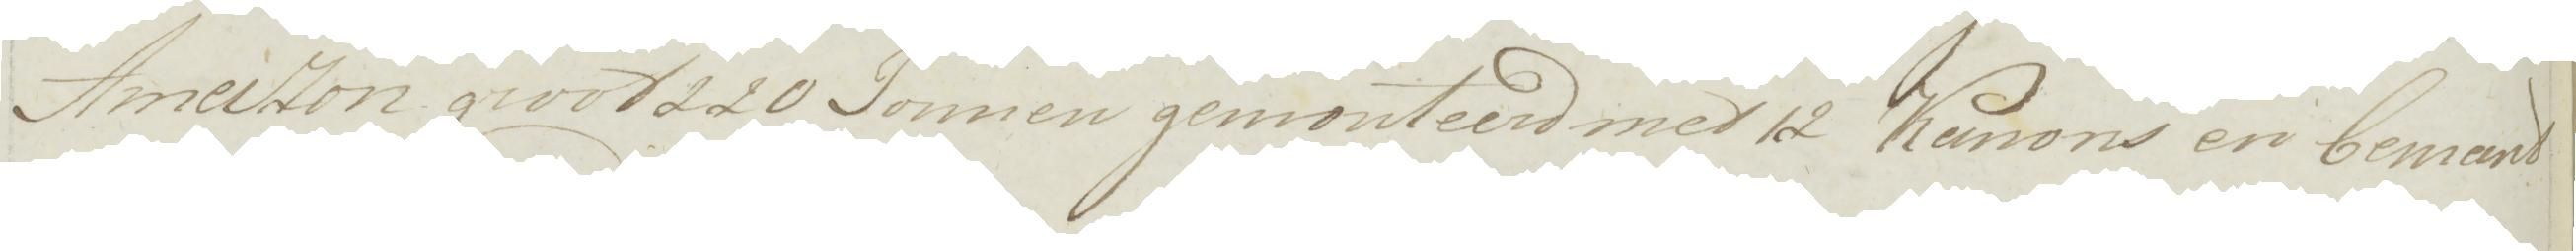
Amazon groot 220 Tonnen gemonteerd met 12 Kanons en bemant
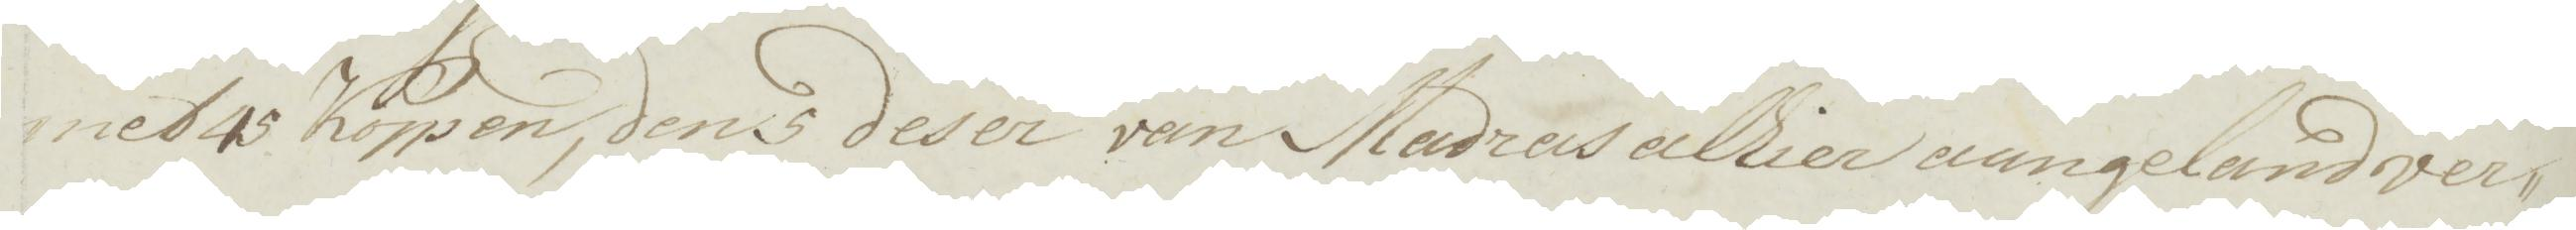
met 45 Koppen, den 5 deser van Madras alhier aangeland ver„
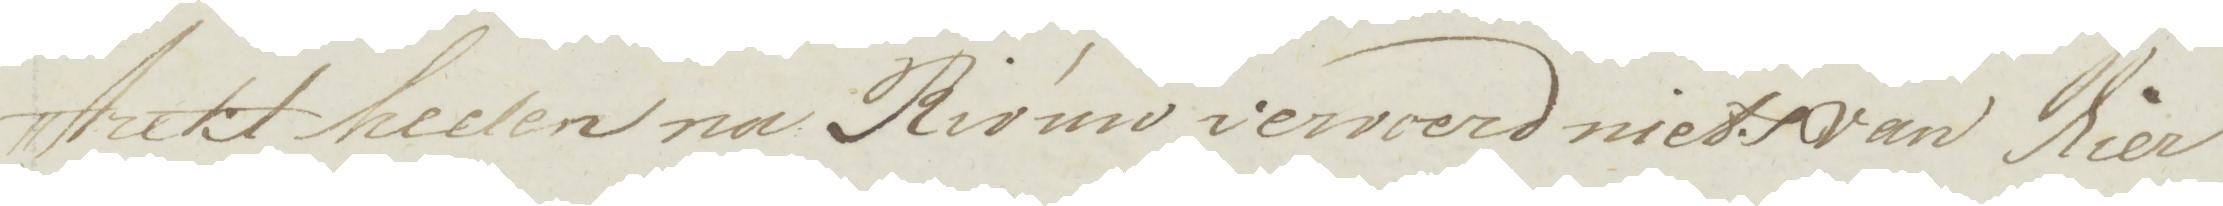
„trekt heelen na Riouw vervoerd niets van hier
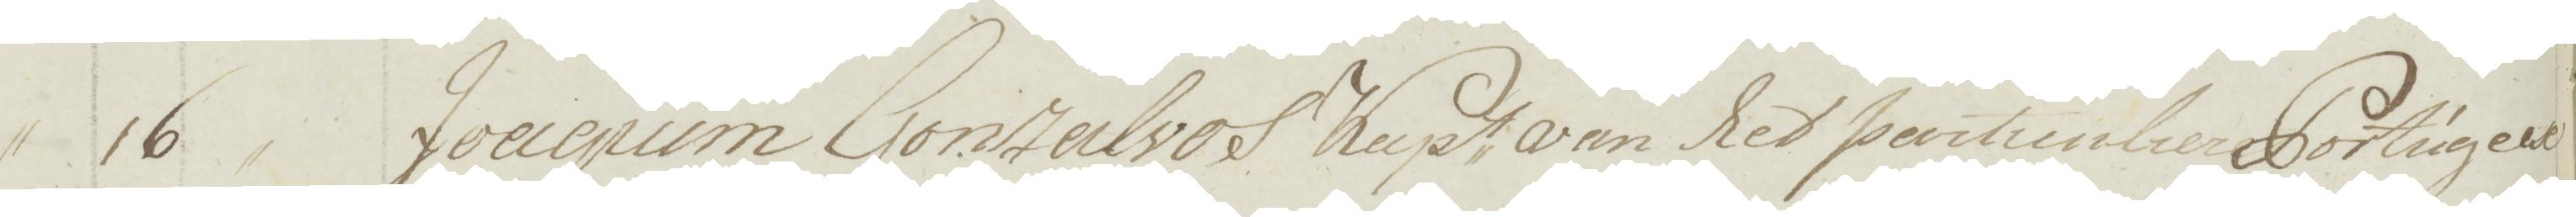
„ 16 „ Joaquim Gonzalvos Kap„t van het particulier Portugeese
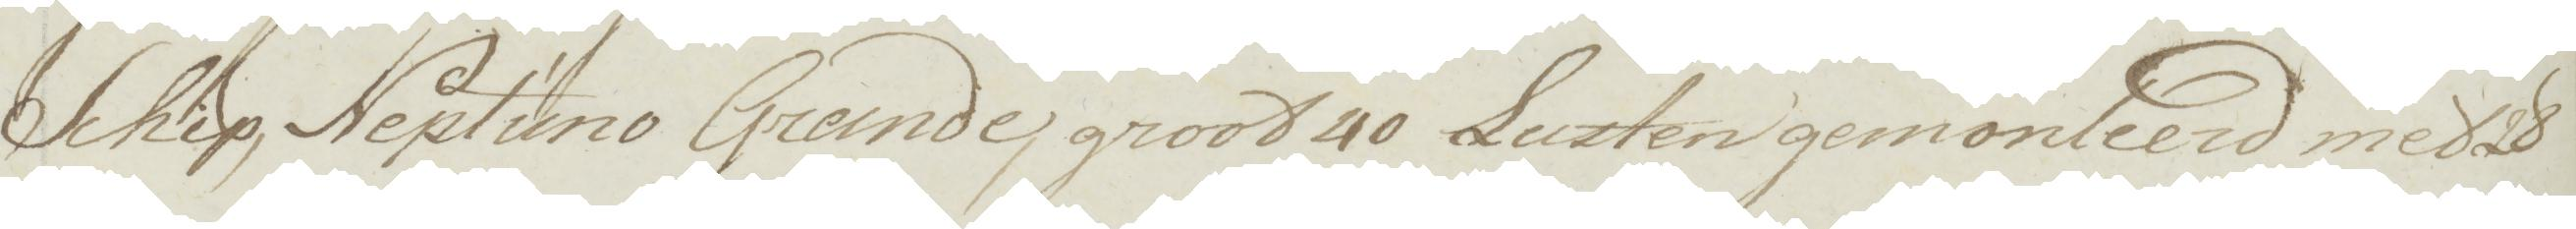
Schip, Neptuno Grande, groot 40 Lasten gemonteerd met 28
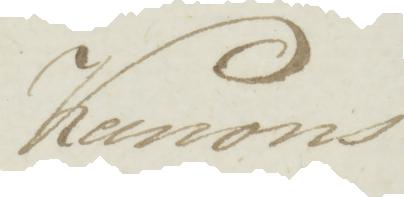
Kanons
